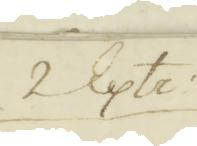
2 Extr
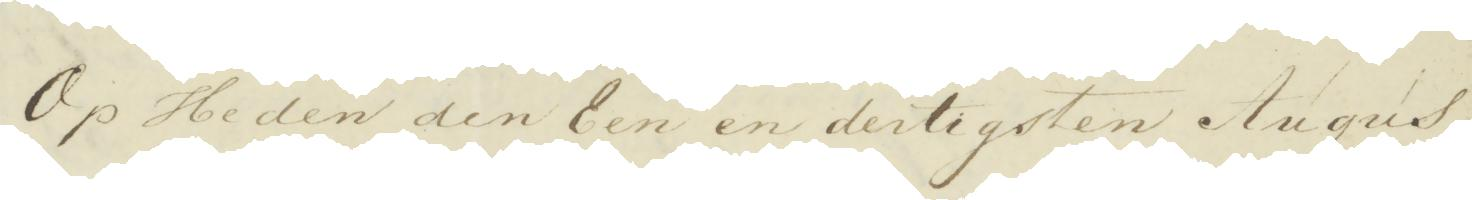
Op Heden den Een en dertigsten Augus
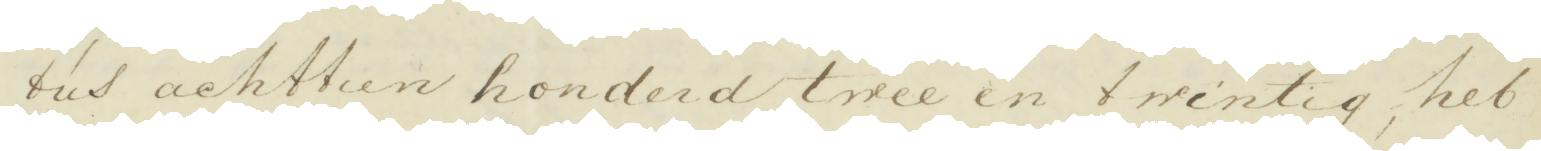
tus achttien honderd twee en twintig, heb
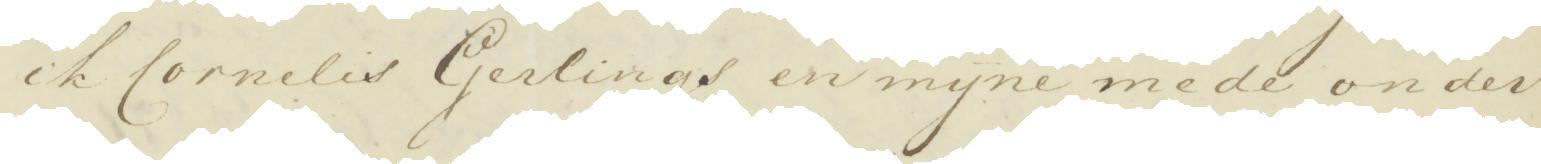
ik Cornelis Gerlings en mijne mede onder
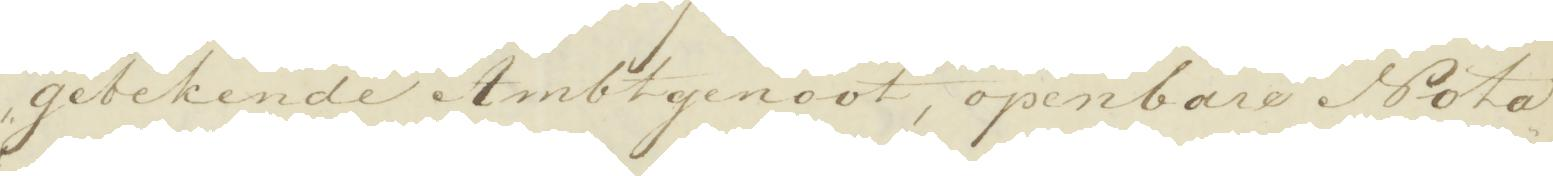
„getekende Ambtgenoot, openbare Nota„
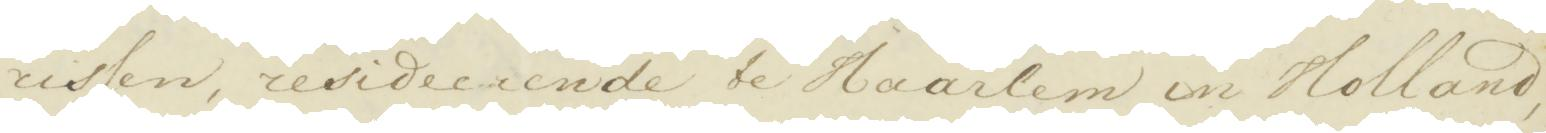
rissen, resideerende te Haarlem in Holland
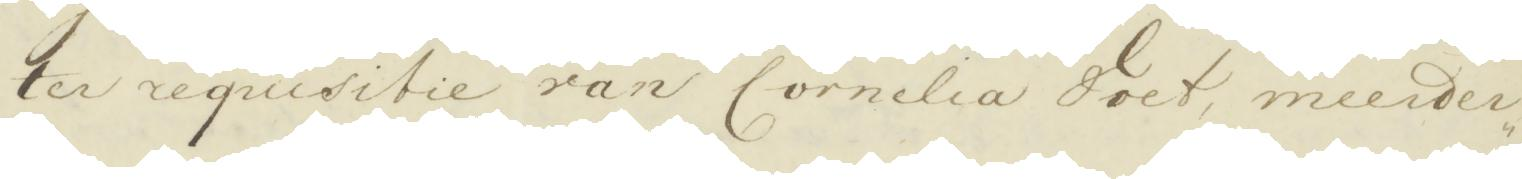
ter requisitie van Cornelia Voet, meerder„
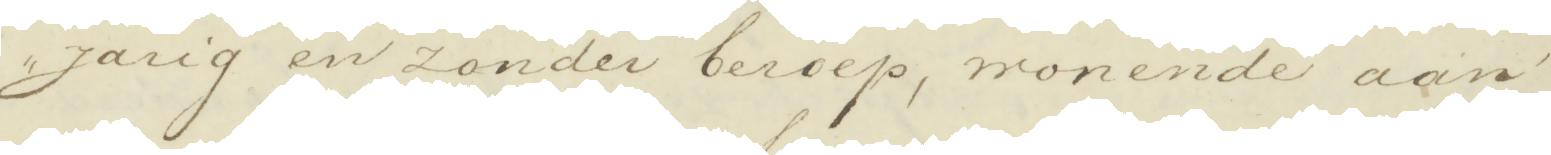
„jarig en zonder beroep, wonende aan
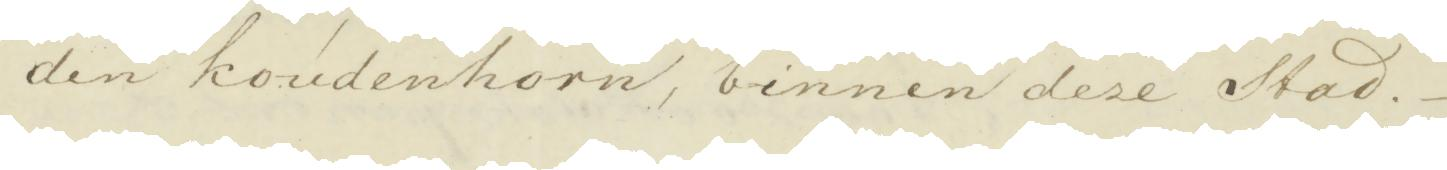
den koudenhorn, binnen deze stad.
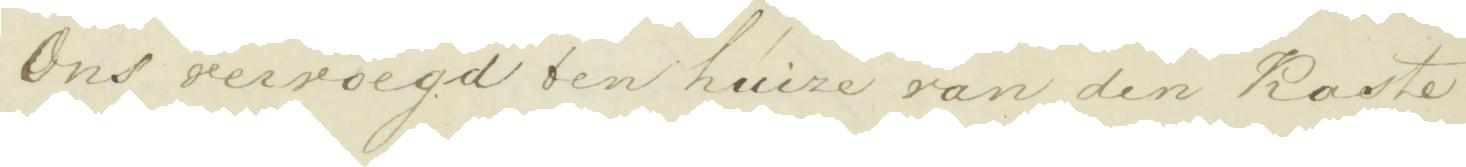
Ons vervoegd ten huize van den Kaste
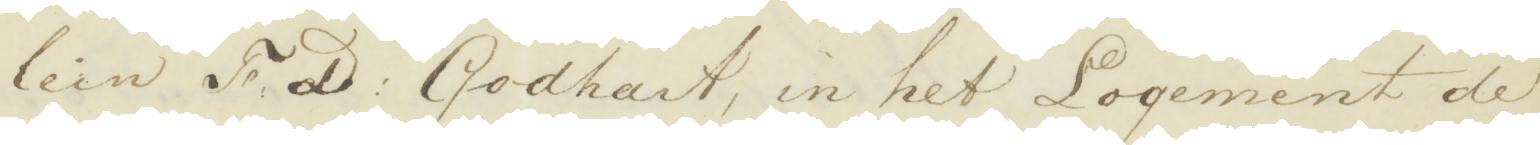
lein F: D: Godhart, in het Logement de
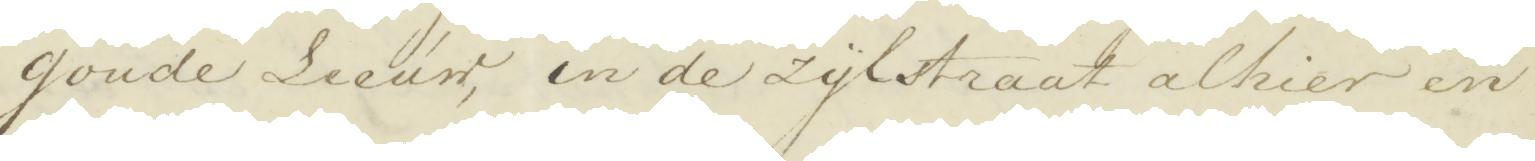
goude Leeuw, in de zijlstraat alhier en
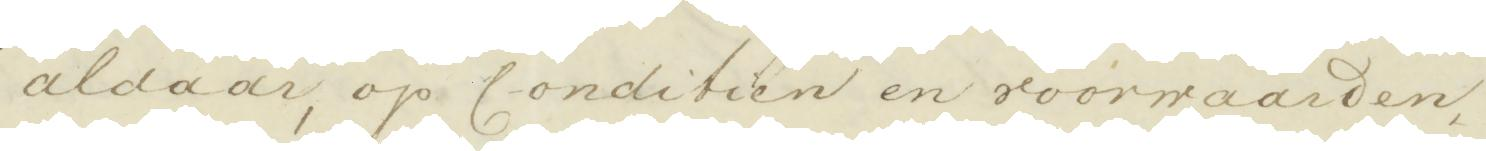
aldaar, op conditien en voorwaarden,
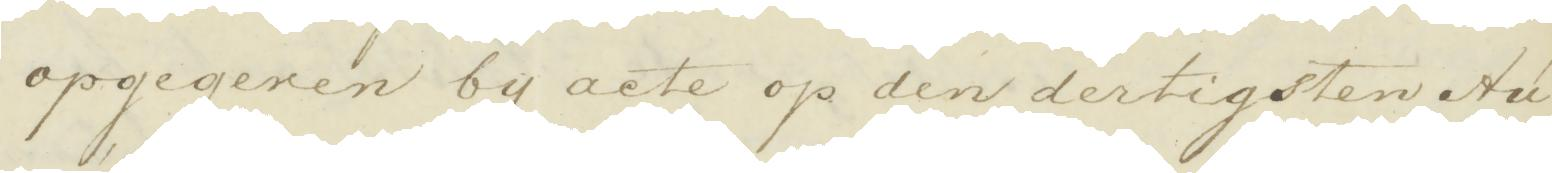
opgegeven bij acte op den dertigsten Au
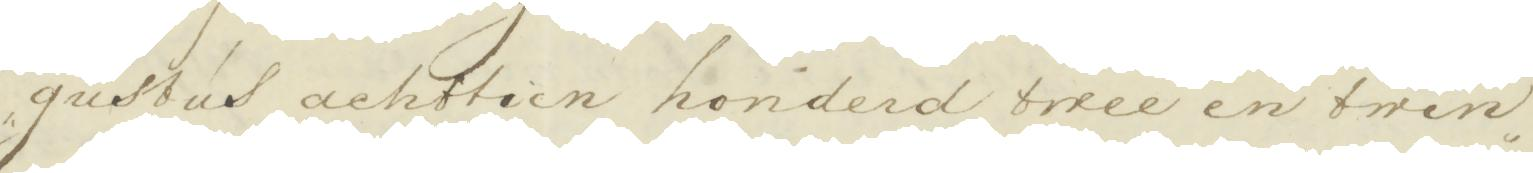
„gustus achttien honderd twee en twin„
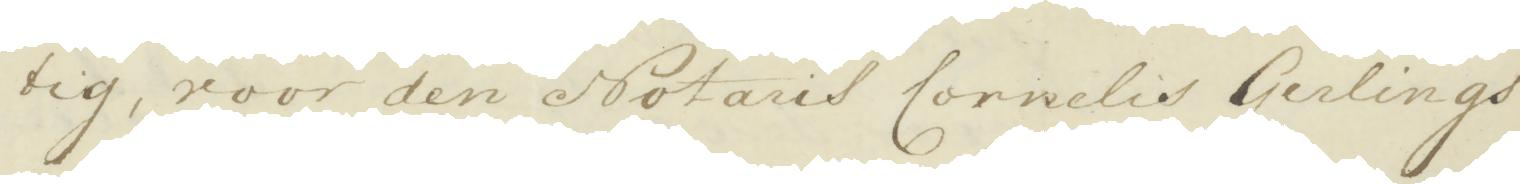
tig, voor den Notaris Cornelis Gerlings
